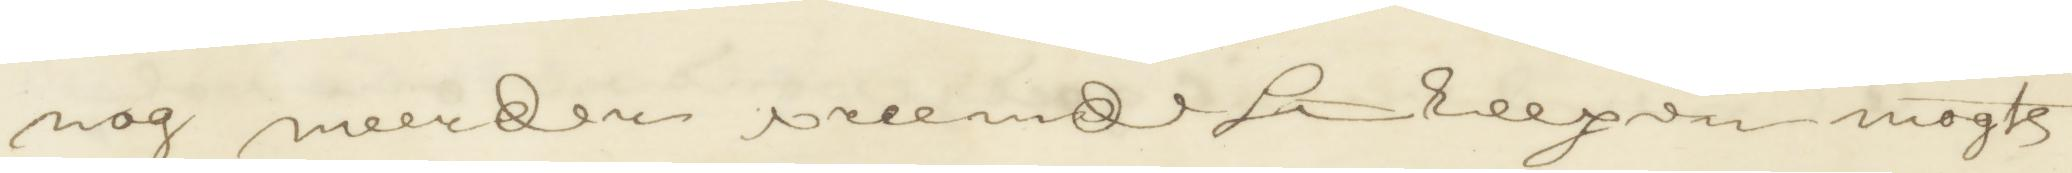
nog meerder vreemde scheepen mogten
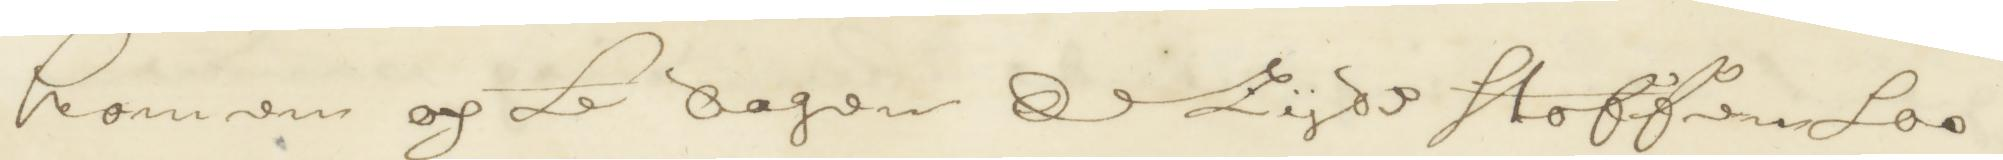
komen op te dagen de zijde stoffen soo
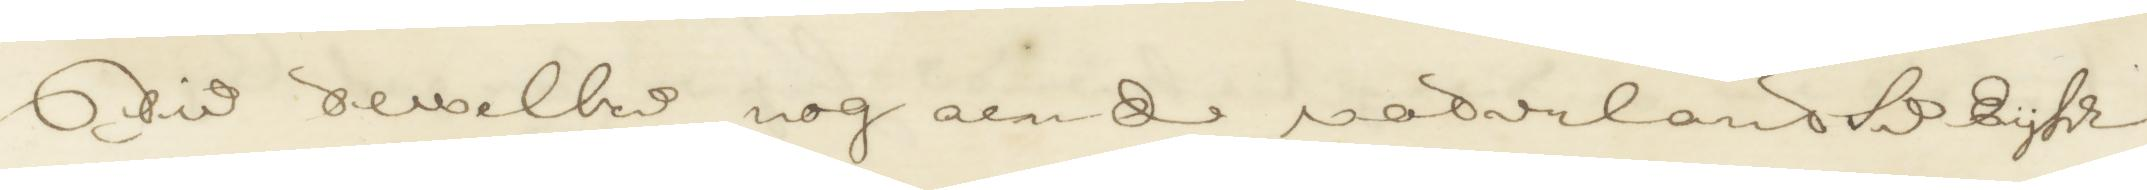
die dewelke nog aen de vaderlandse Eijsch
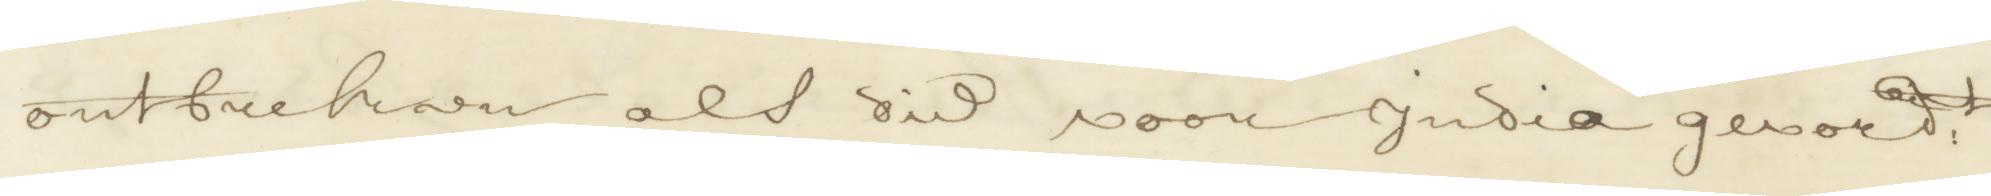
ontbreken als die voor jndia gevord:t
